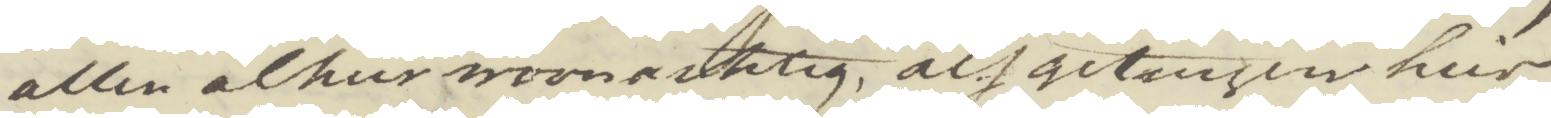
allen alhier woonachtig, als getuigen hier
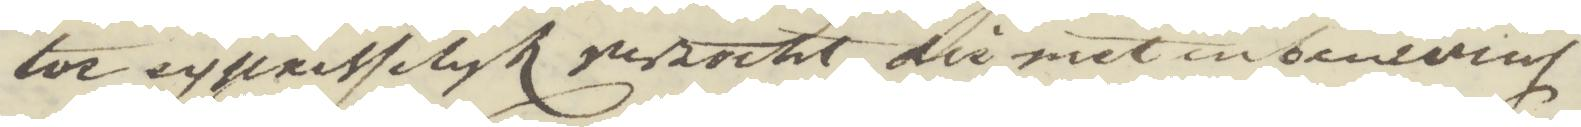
toe expresselyk verzocht, die met en benevens
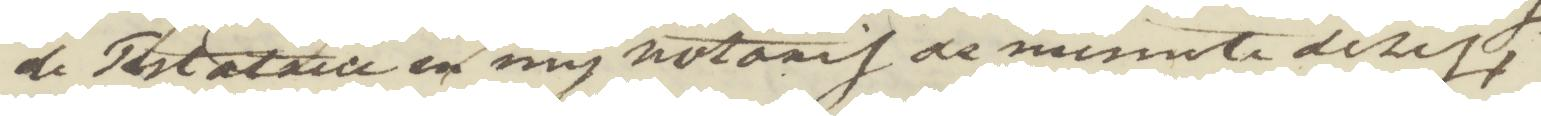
de Testatrice en my notaris de minute dezes,
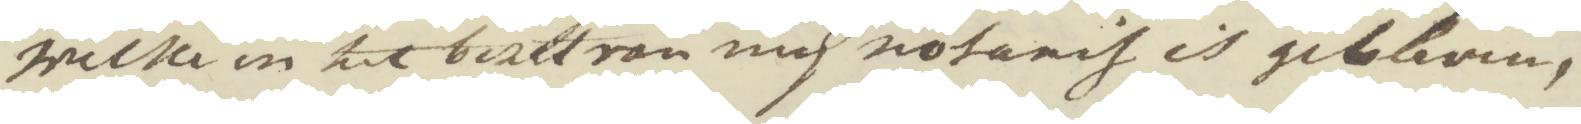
welke in het bezit van my notaris is gebleven,
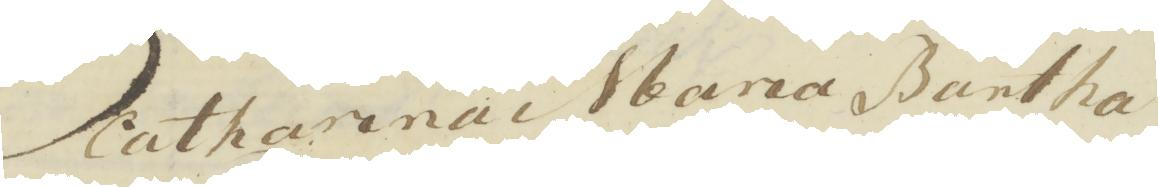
Catharina Maria Bantha
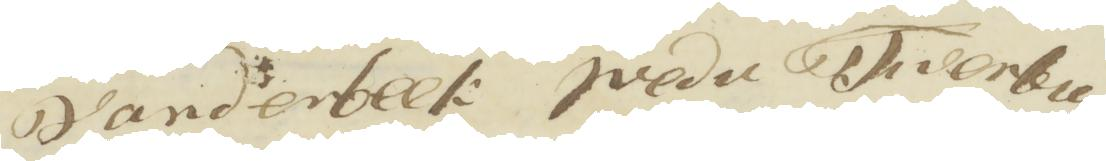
Van der beek wedu T. verburg
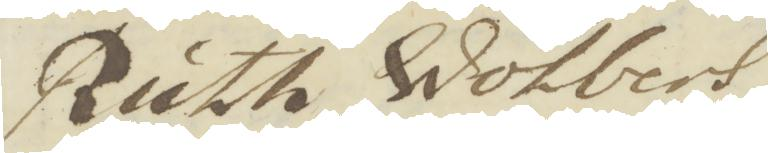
Ruth Wolbers
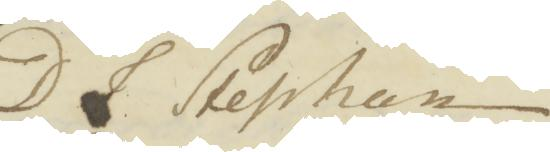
D J: Stephan
